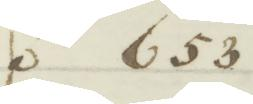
653
